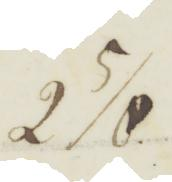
2 5/8.
